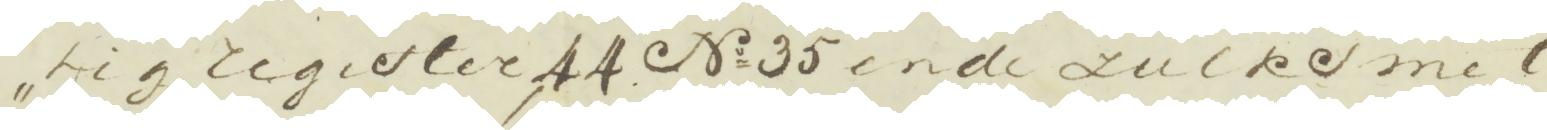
„tig register 44 N=o 35 ende zulks met
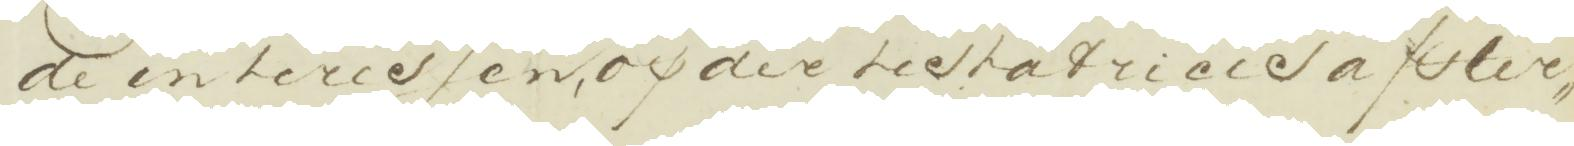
de interessen, op der testatrices afster„
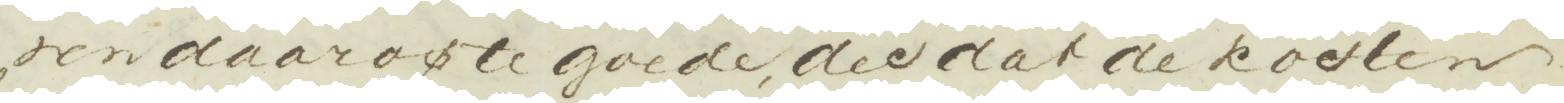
„ven daar op te goede, des dat de kosten
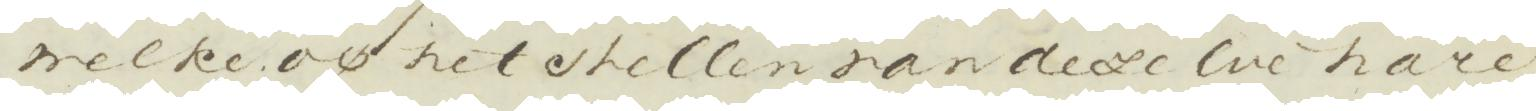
welke op het stellen van dezelve hare
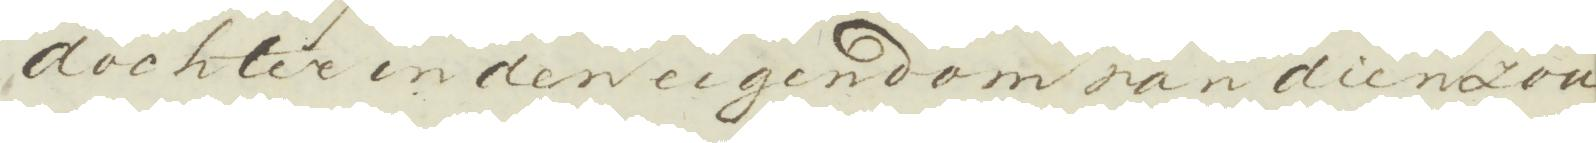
dochter in den eigendom van dien zou
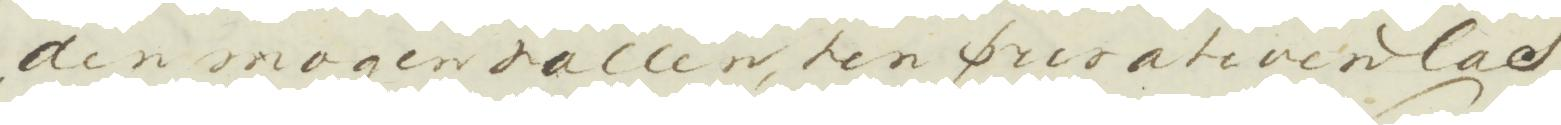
den mogen vallen, ten privativen las
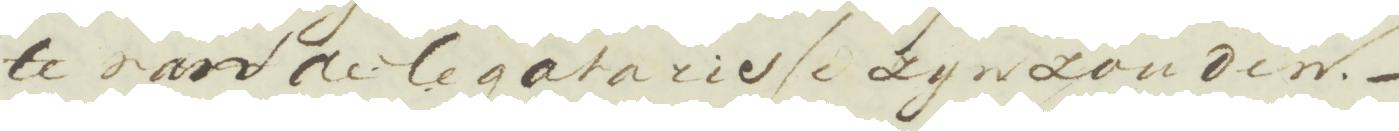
te van de legatarisse zyn zouden.—
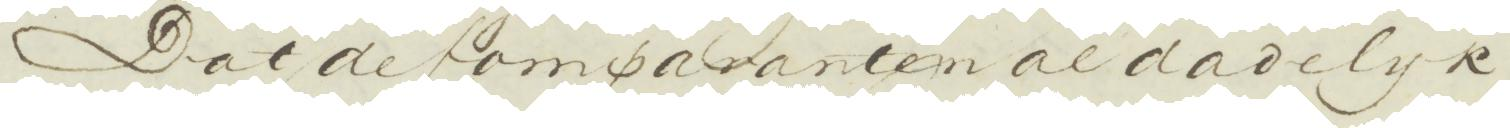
Dat de Comparanten al dadelyk
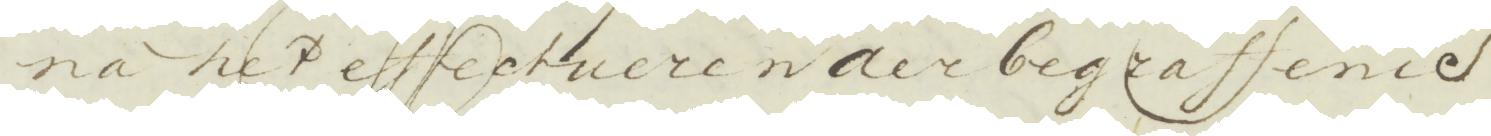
na het effectueren der begraffenis
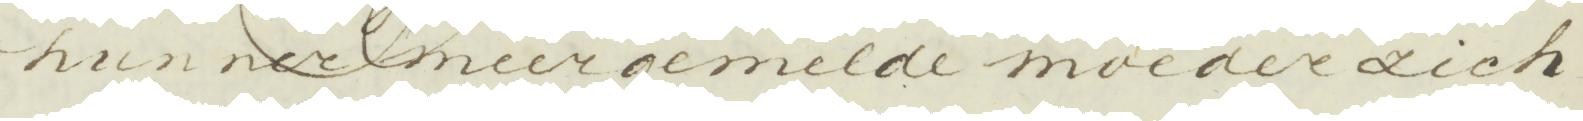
hunner meergemelde moeder zich
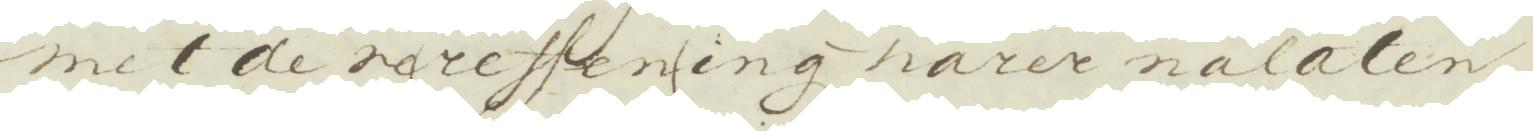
met de vereffening harer nalaten
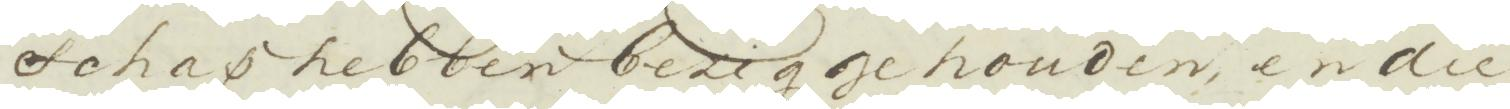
schap hebben beziggehouden, en die
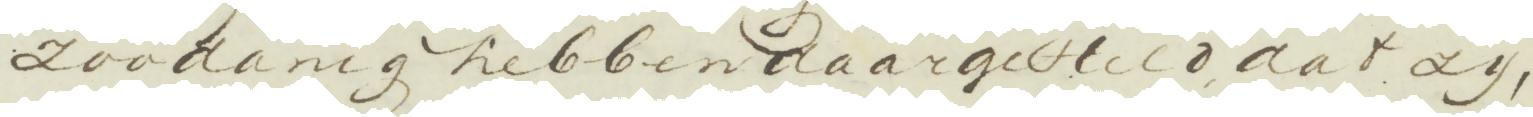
zoodanig hebben daargesteld, dat zy,
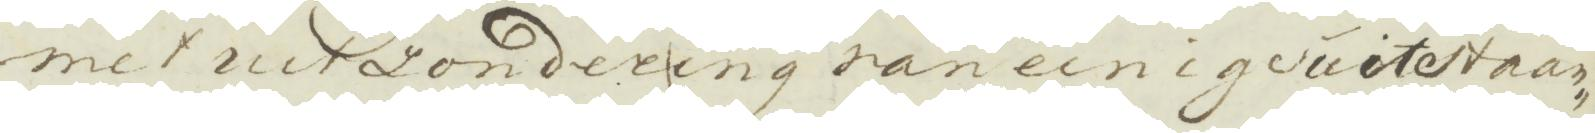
met uitzondering van eenige uitstaan„
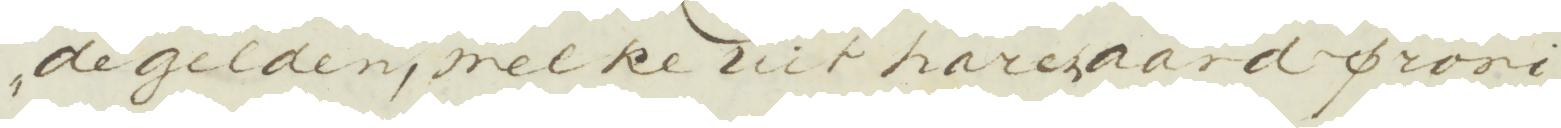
„de gelden, welke uit haren aard provi
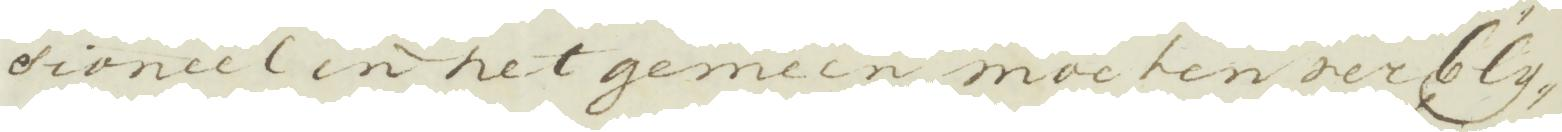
sioneel in het gemeen moeten verbly„
